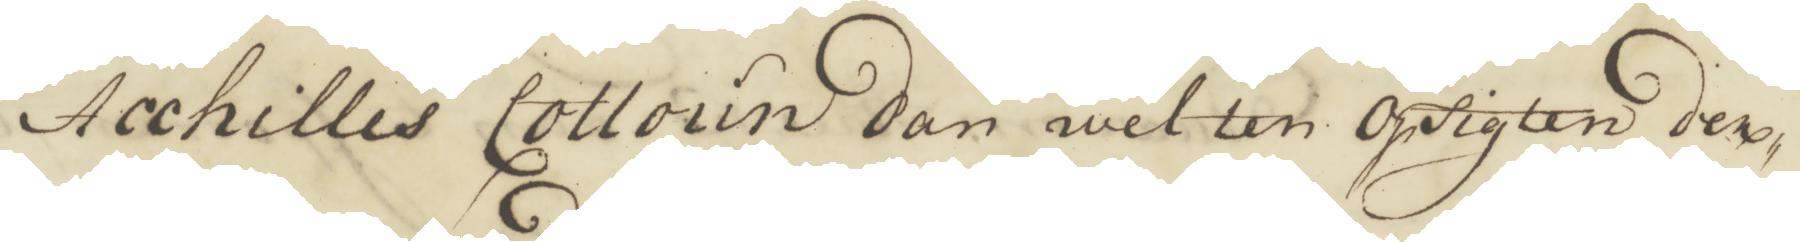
Acchilles Cottoun dan wel ten opsigten der„
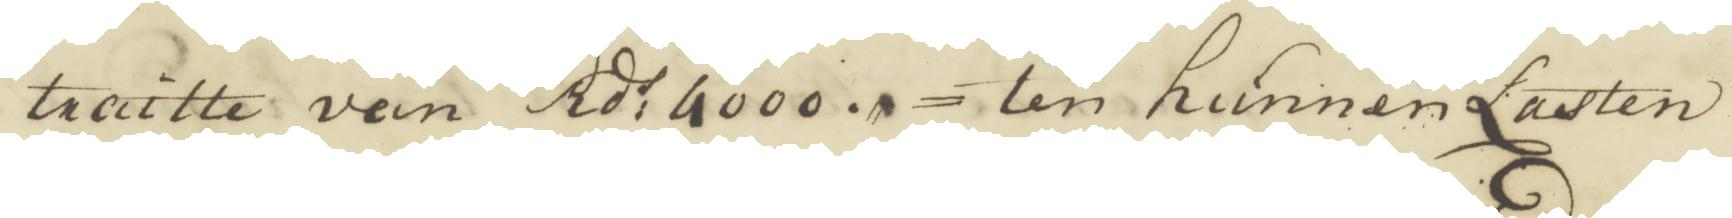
traitte van Rd:s 4000. „ = ten hunnen Lasten
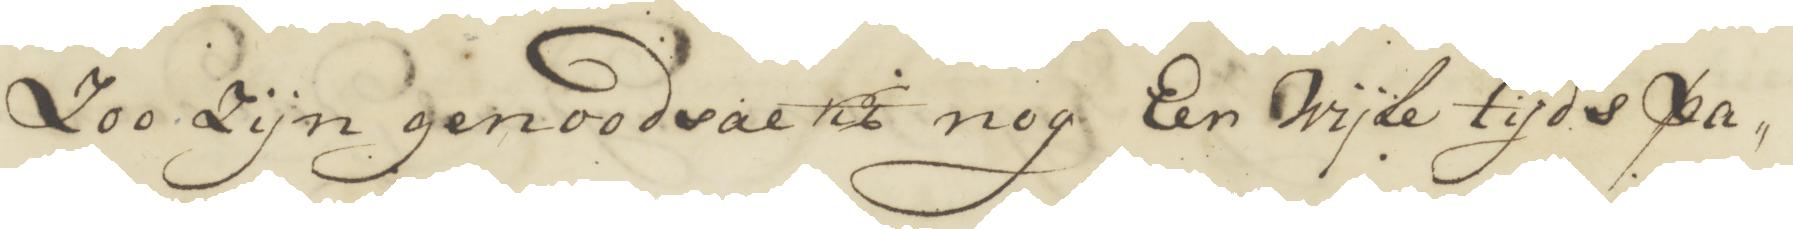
zoo zijn genoodsaekt nog Een wijle tijds pa„
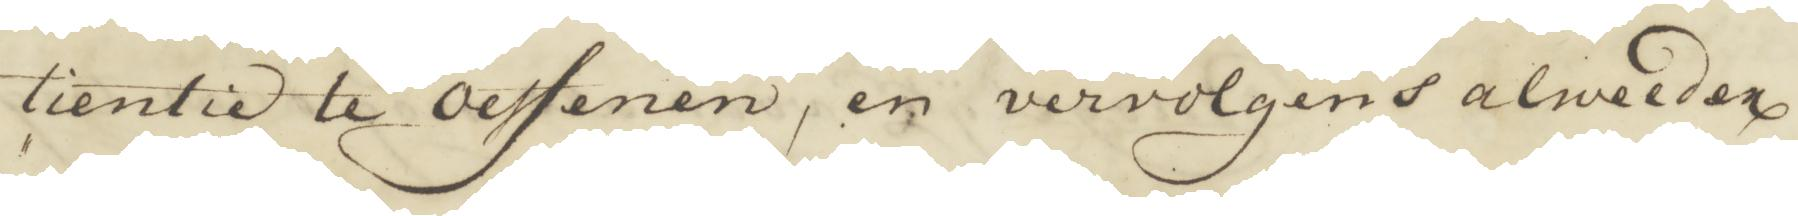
„tientie te oeffenen, en vervolgens alweeder
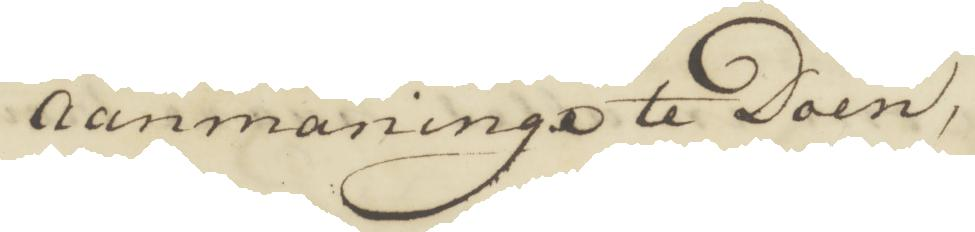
aanmaninge te Doen,
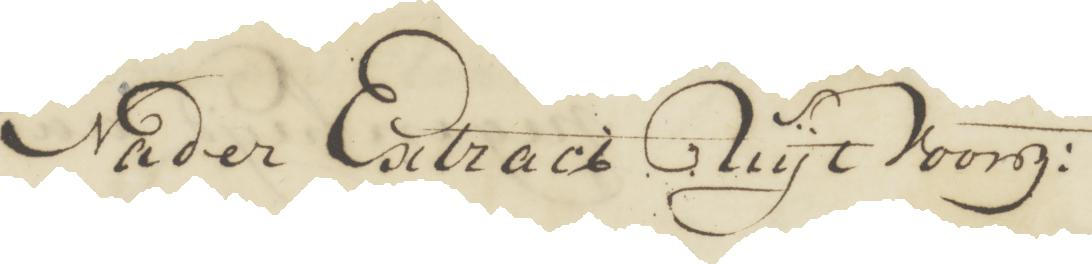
Nader Extract Uijt Voorz:
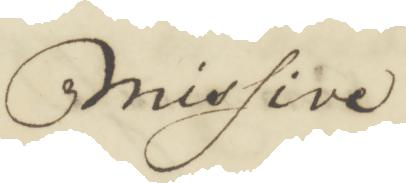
Missive
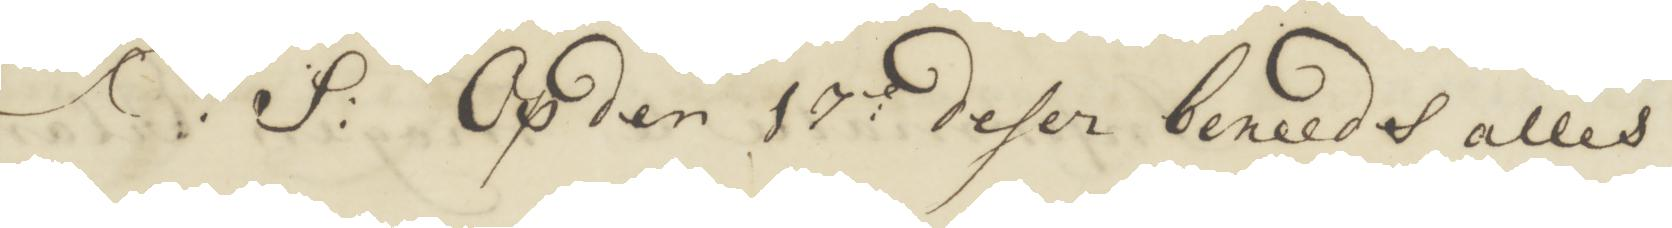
P: S: Op den 17:e deser bereeds alles
